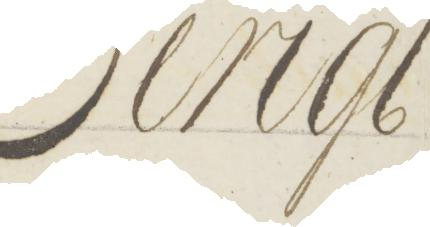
erigt
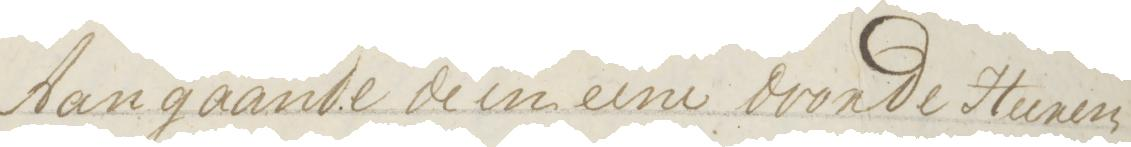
Aan gaande de in eene doorde Heeren
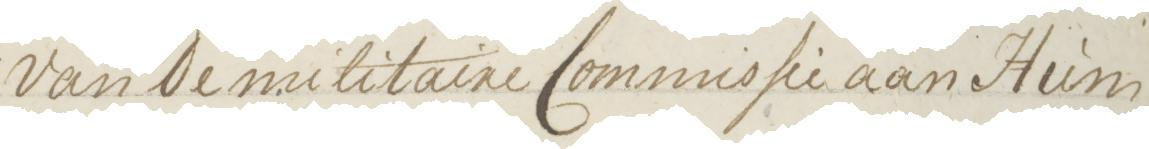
van de militaire Commissie aan Hun
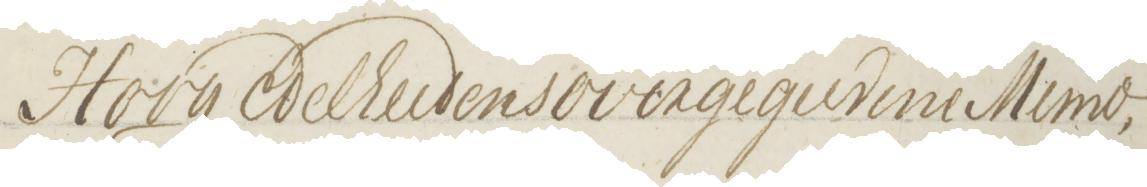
Hoog Edelheedens overgegeevene Memo,
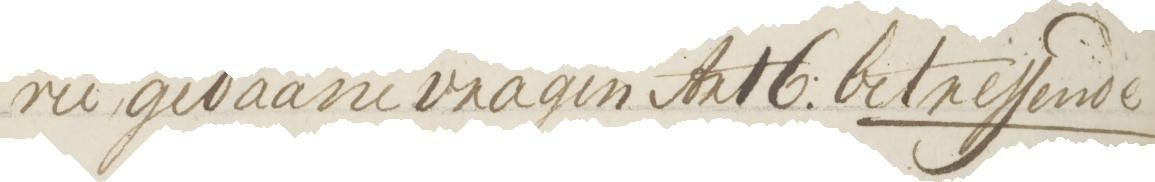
rie, gedaane vragen Art 6: betreffende
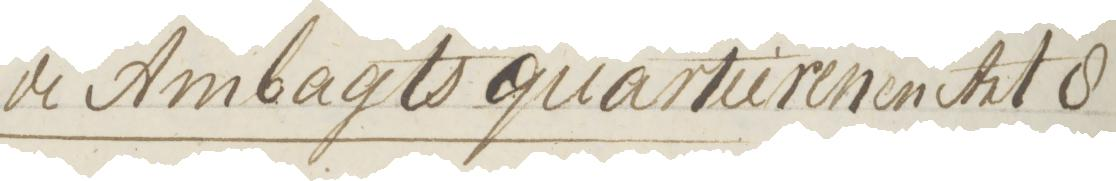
de Ambagts Quartieren en Art 8
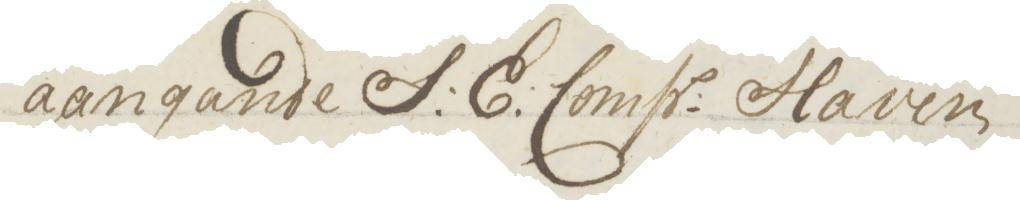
aangande S: E: Comp: Slaven
